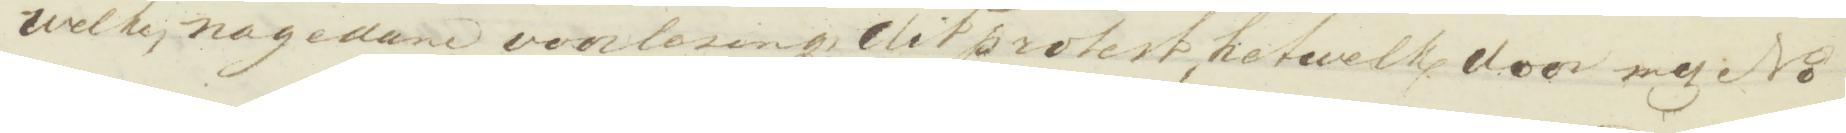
welke, na gedane voorlezing, dit protest, hetwelk door my No
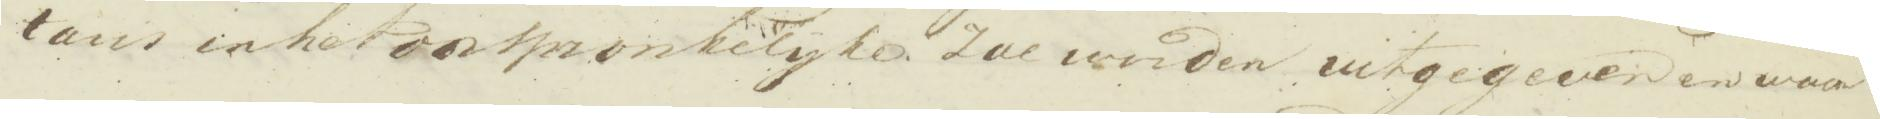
taris in het oorspronkelijke zal worden uitgegeven en waar
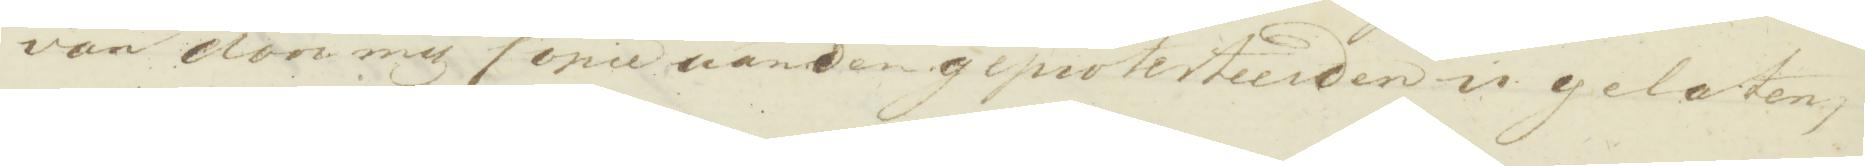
van door my Copie aan den geprotesteerden is gelaten,
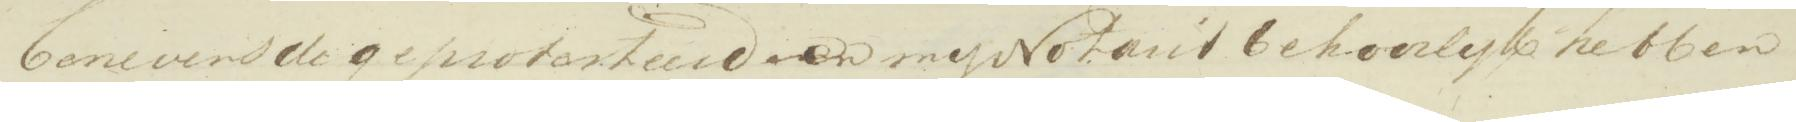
benevens de geprotesteerden my Notaris behoorlyk hebben
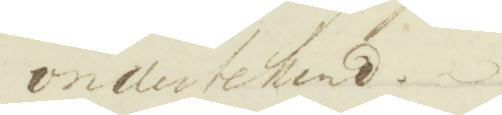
ondertekend.
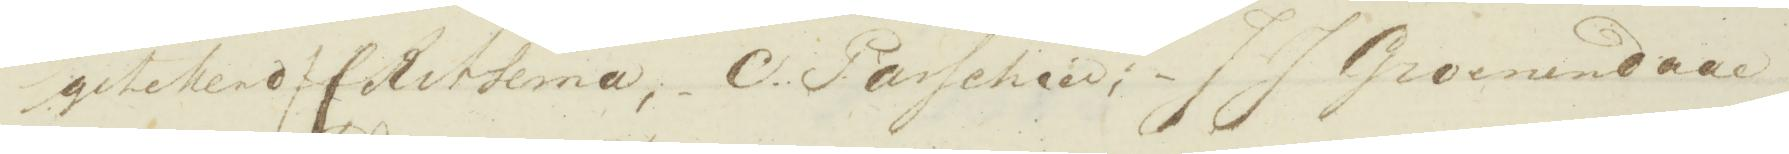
getekend J C Ritsema, C. Passchier; J J Groenendaal
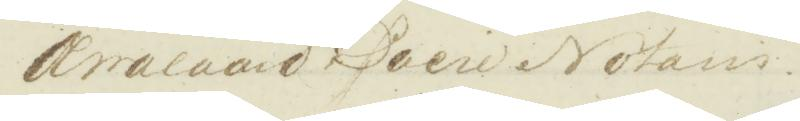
AE Walaardt Sacré Notaris
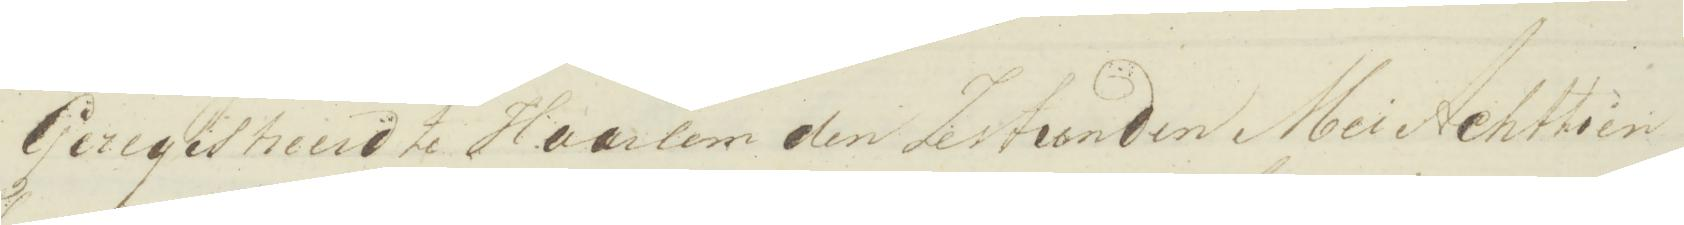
Geregistreerd te Haarlem den Zestienden Mei Achttien
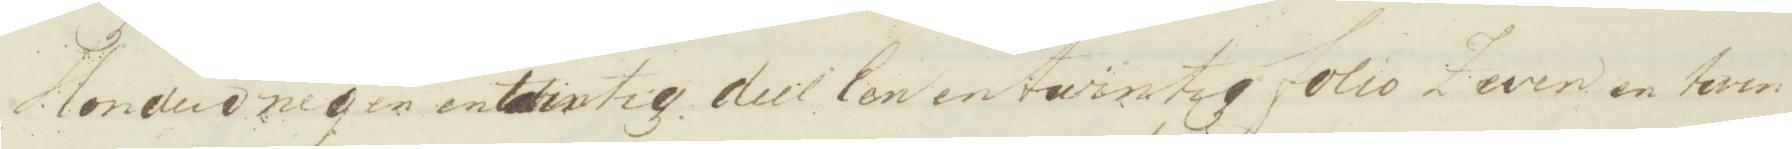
Honderd negen en twintig, deel Een en twintig folio Zeven en twin
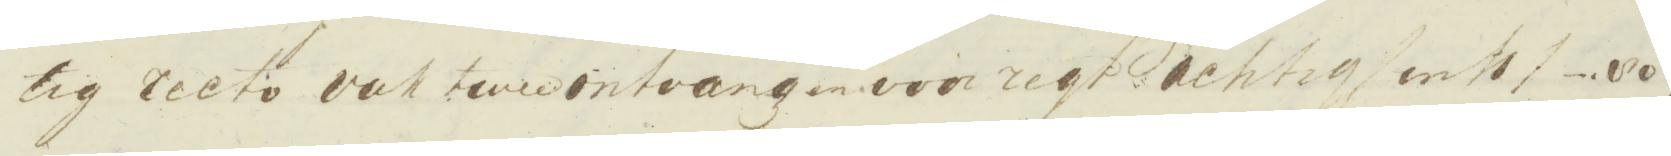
tig recto vak twee ontvangen voor regt Tachtig Cents ƒ —. 80
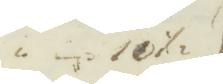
13 pCt „ — . 10½
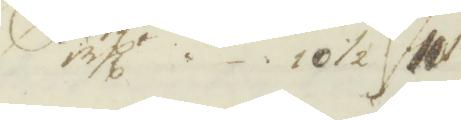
13 pCt „ — . 10½ } ƒ 1.01
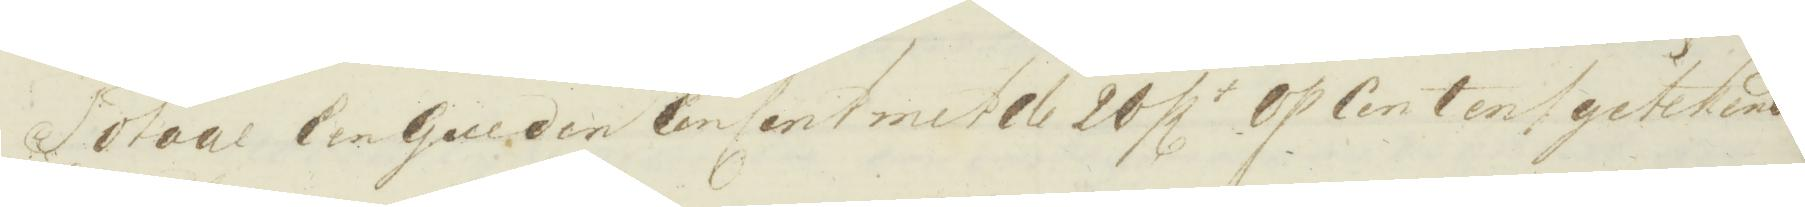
Totaal Een Gulden Een Cent met de 20 PCt opCenten / getekend
